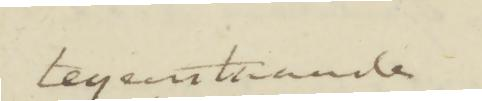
tegenstaande
